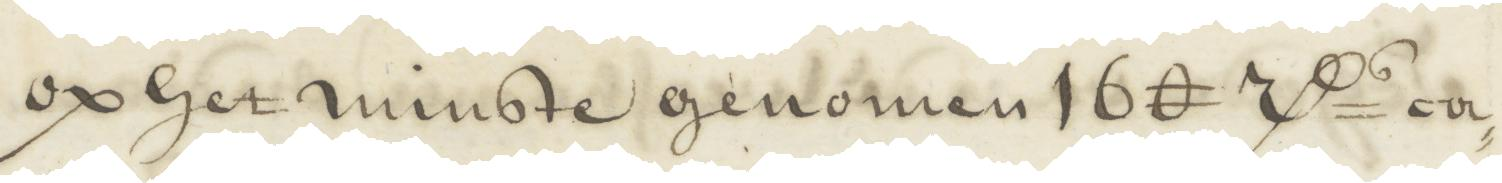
op het minste genomen 16Ø rx=s ca„
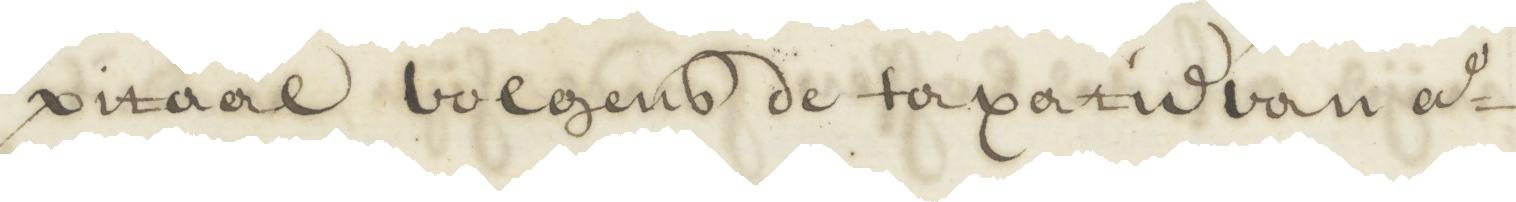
pitaal volgens de taxatie van a=o
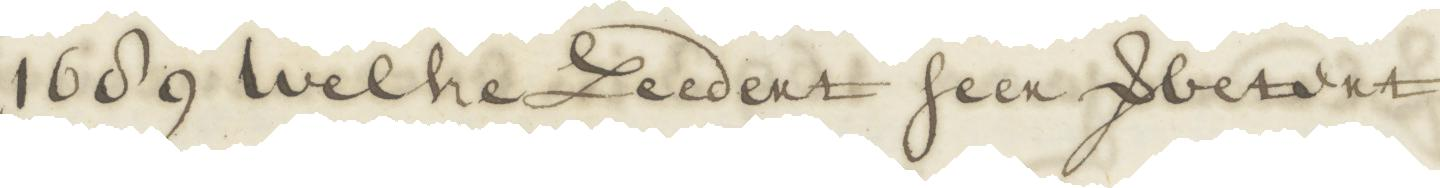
1689 welke zeedert seer verbetert
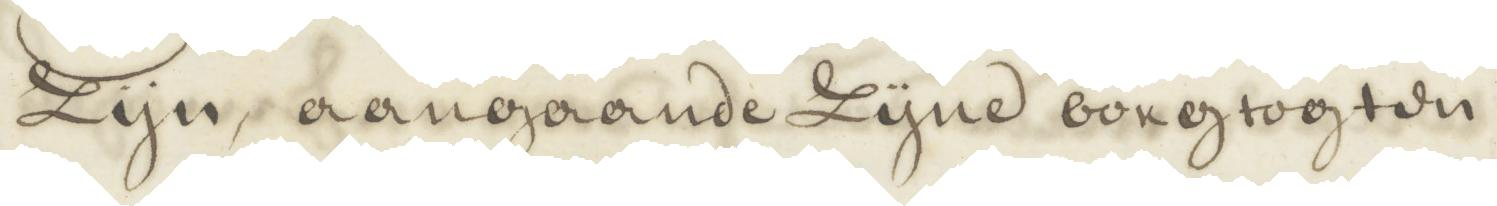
zijn, aangaande zijne borgtogten
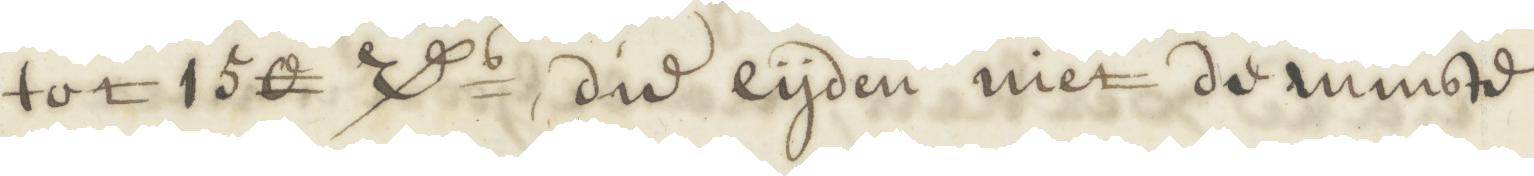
tot 15Ø rx=s, die lijden niet de minste
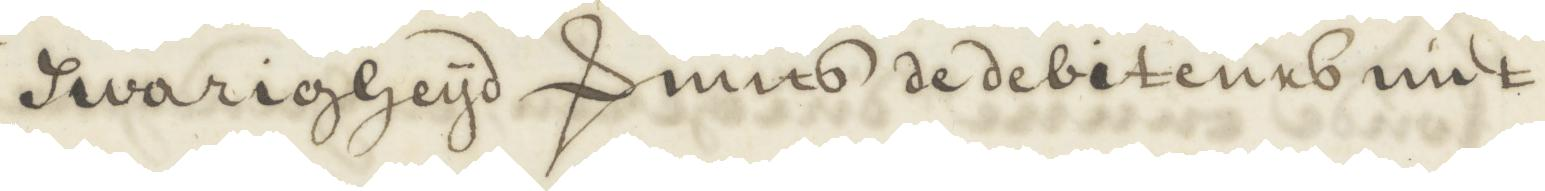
swarigheijd vermits de debiteurs niet
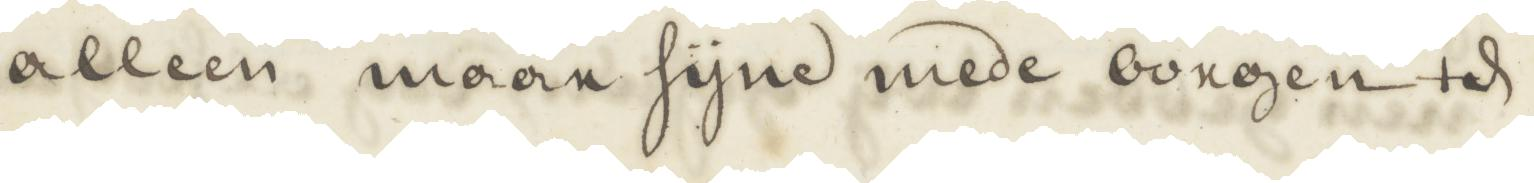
alleen maar sijne mede borgen ten
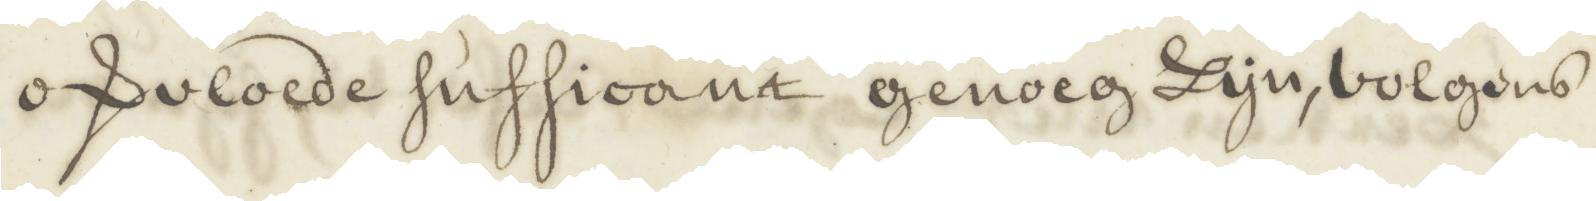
overvloede sufficant genoeg zijn, volgens
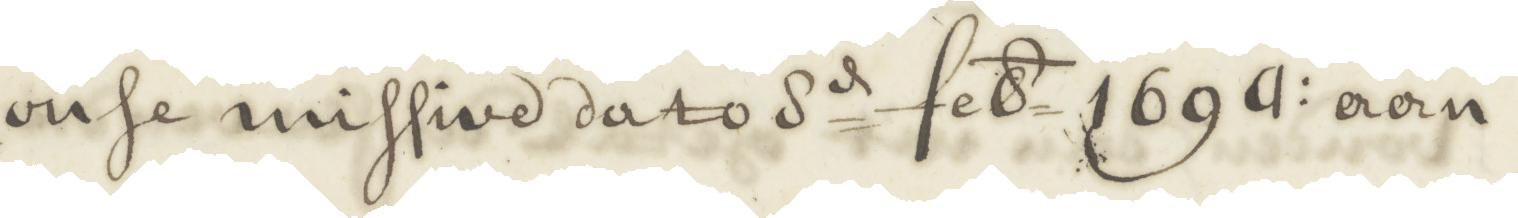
onse missive dato 8=en feb= 1694: aan
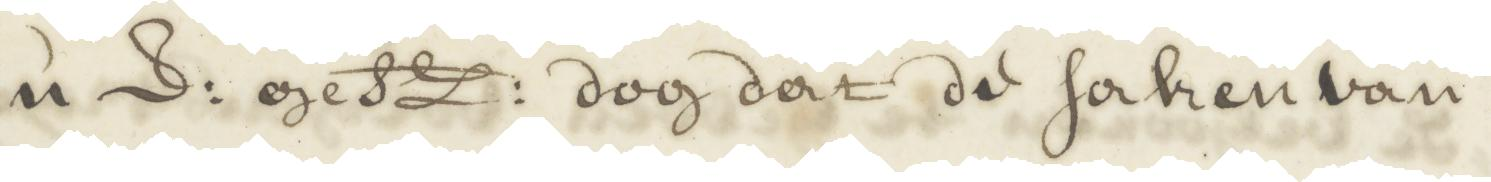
u E: gesz: dog dat de saken van
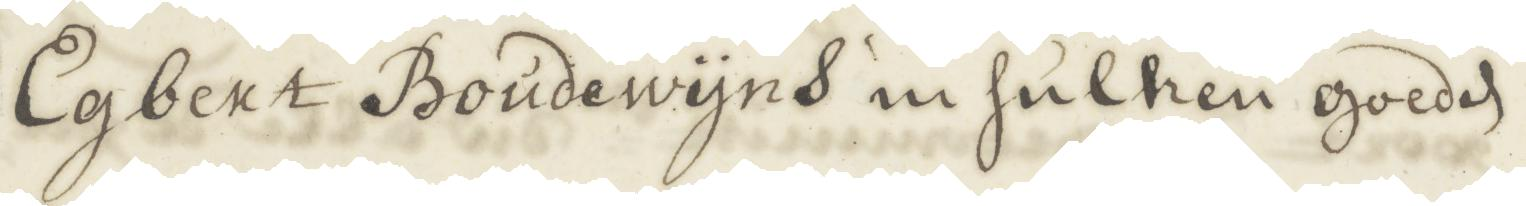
Egbert Boudewijns in sulken goeden
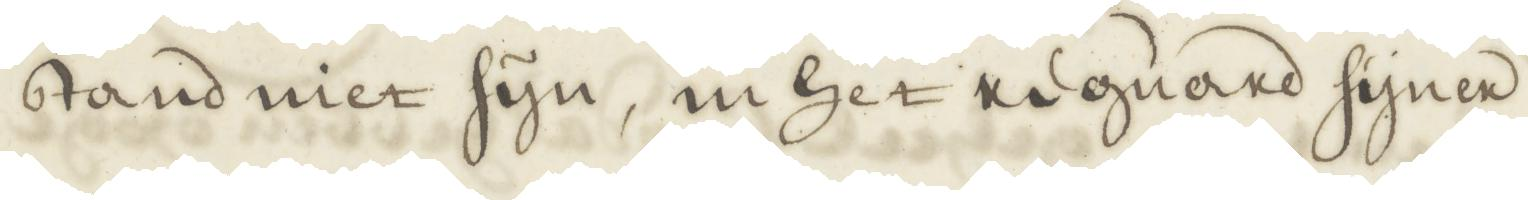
stand niet sijn, in het reguard sijner
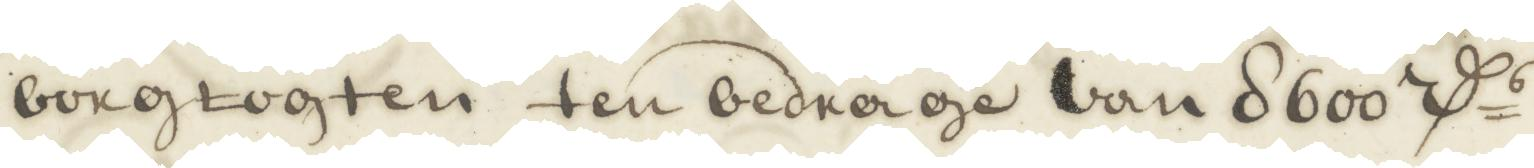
borgtogten ten bedrage van 8600 rx=s
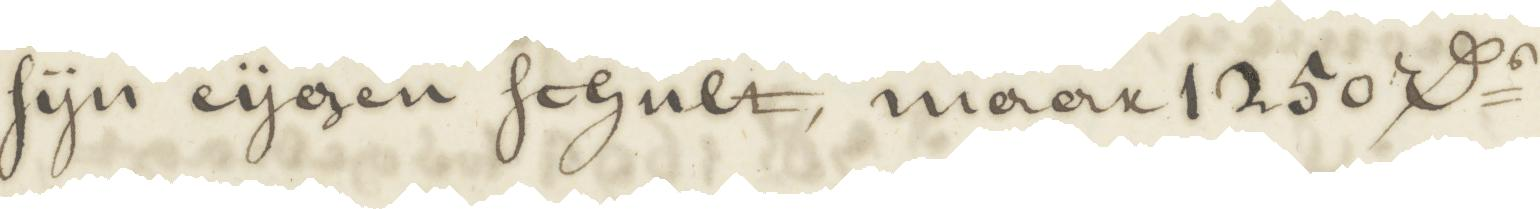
sijn eijgen schult, maar 1250 rx=s
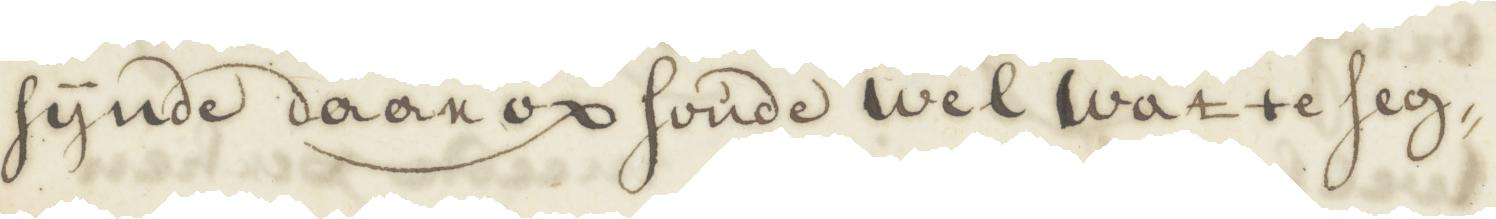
sijnde daar op soude wel wat te seg„
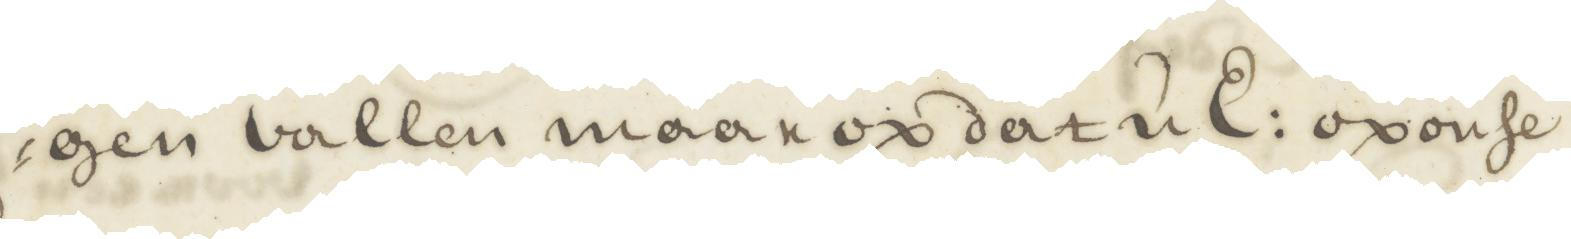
„gen vallen maar op dat uE: op onse
